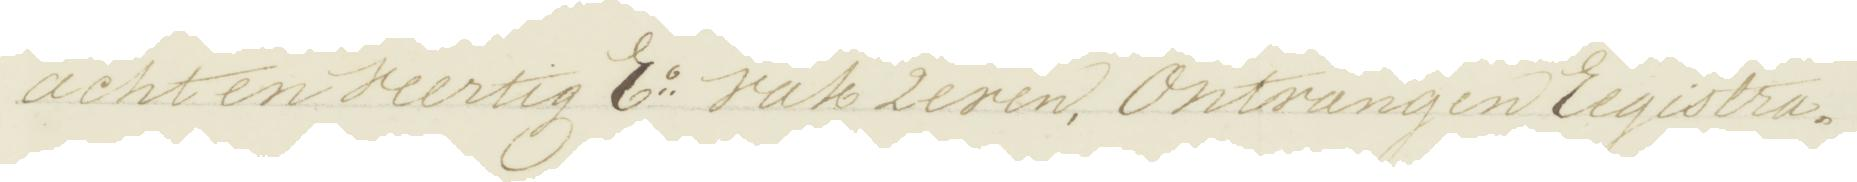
acht en veertig R„o vak zeven, Ontvangen Registra„
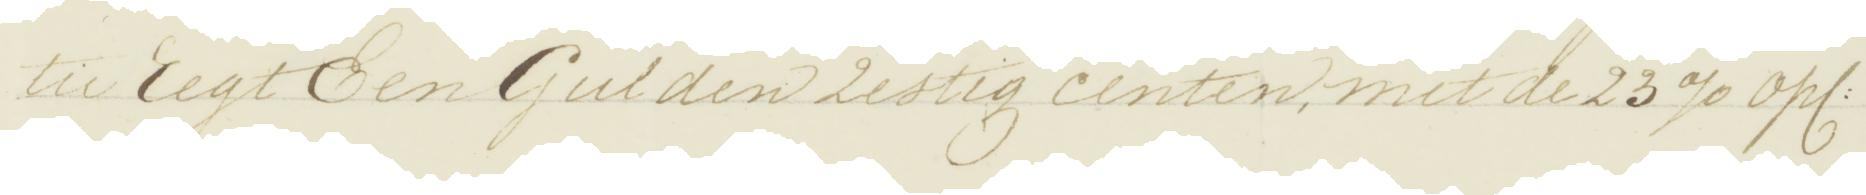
tie Regt Een Gulden zestig centen, met de 23% opC:
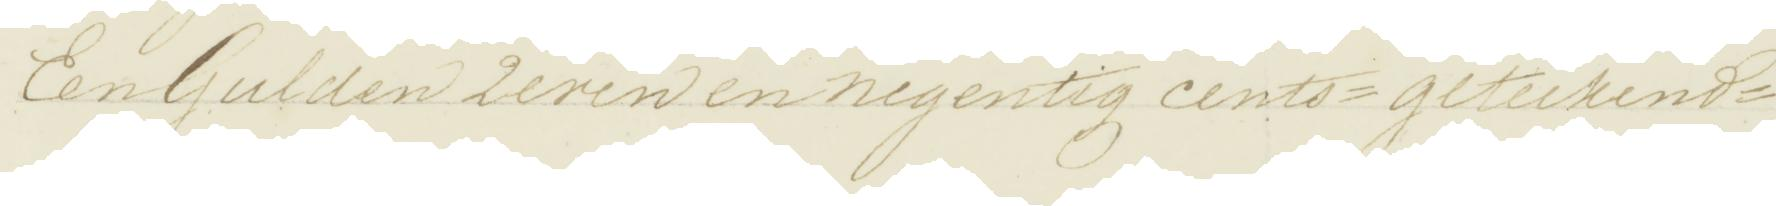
Een Gulden zeven en negentig cents = geteekend =
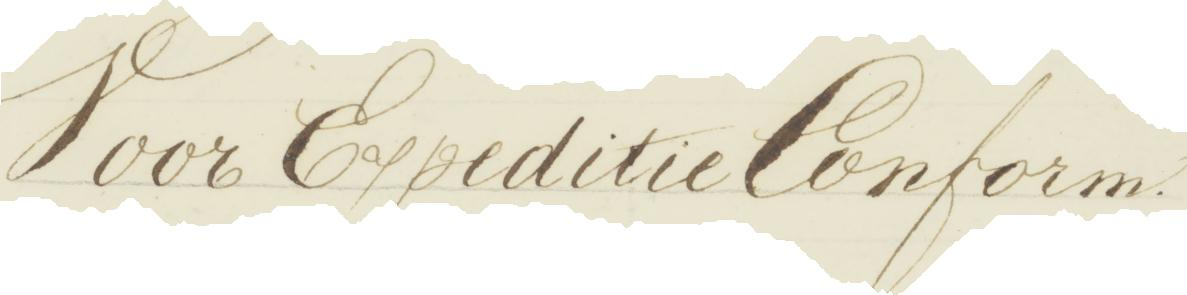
Voor Expeditie Conform.
